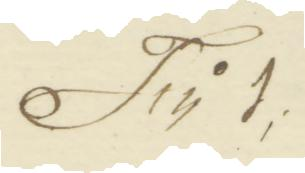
F„o 1;
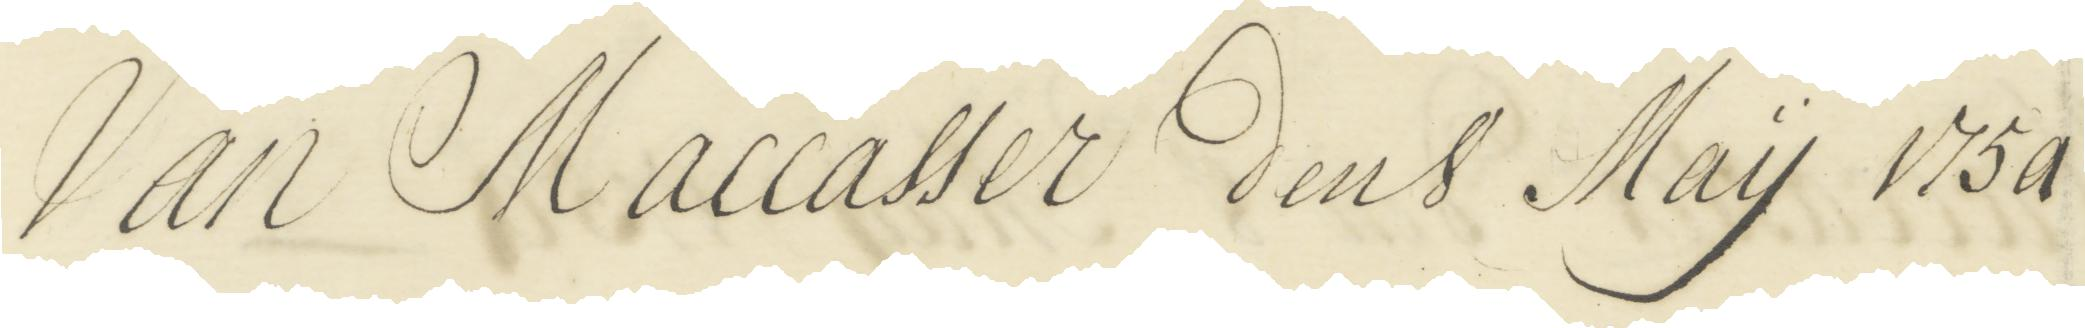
Van Maccasser den 8 Maij 1754
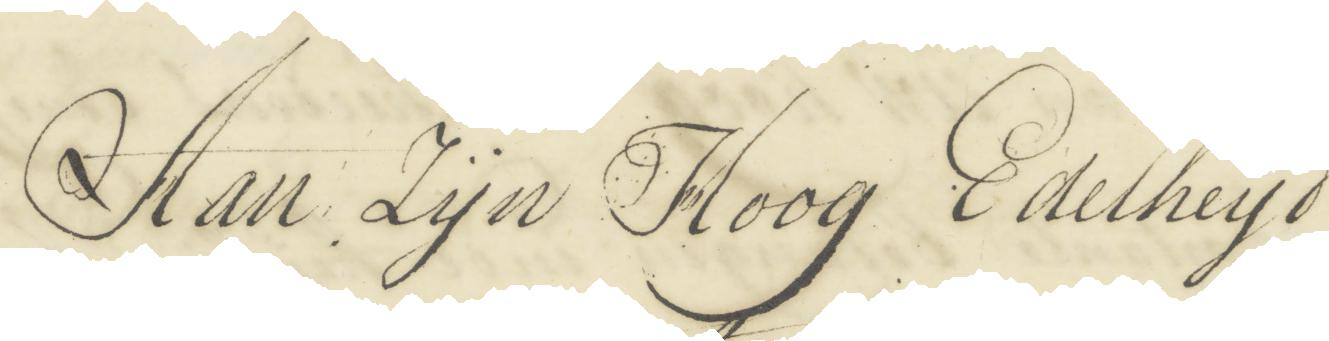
Aan Zijn Hoog Edelheijd
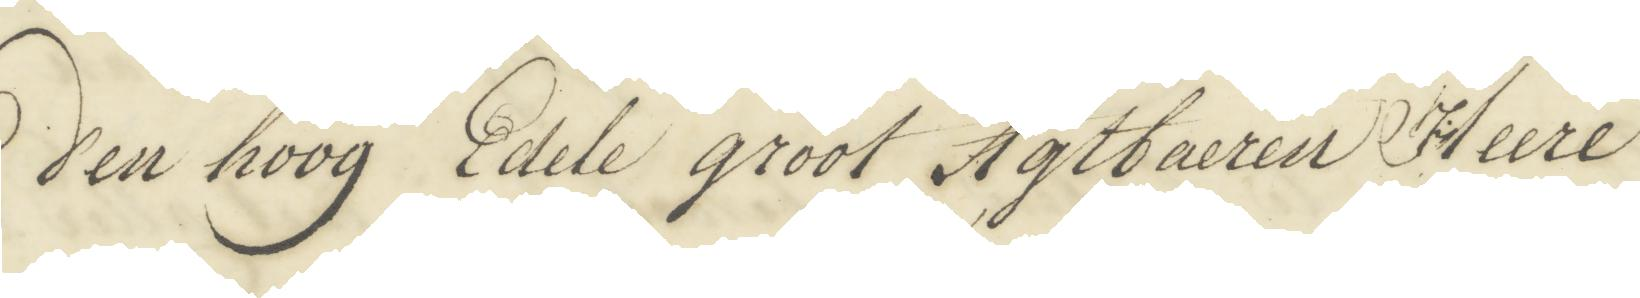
den hoog Edele groot Agtbaeren Heere
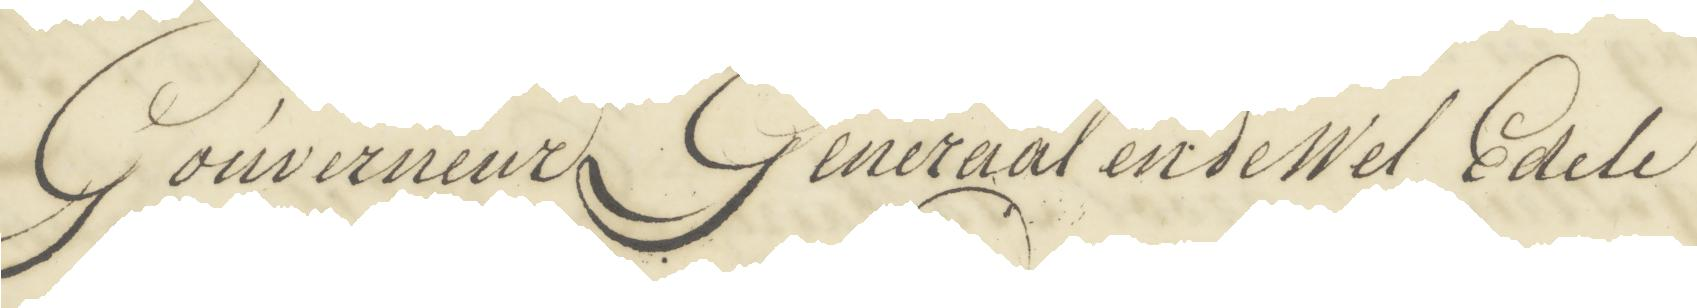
Gouverneur Generaal en de wel Edele
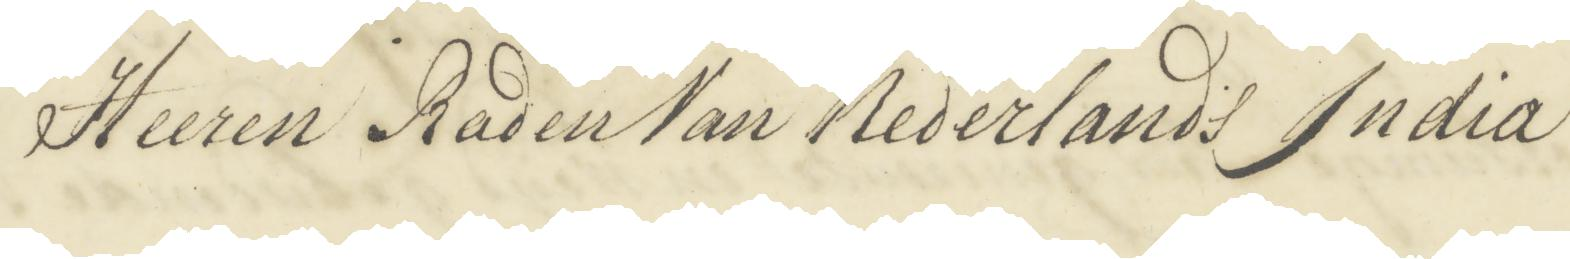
Heeren Raden Van Nederlands Jndia
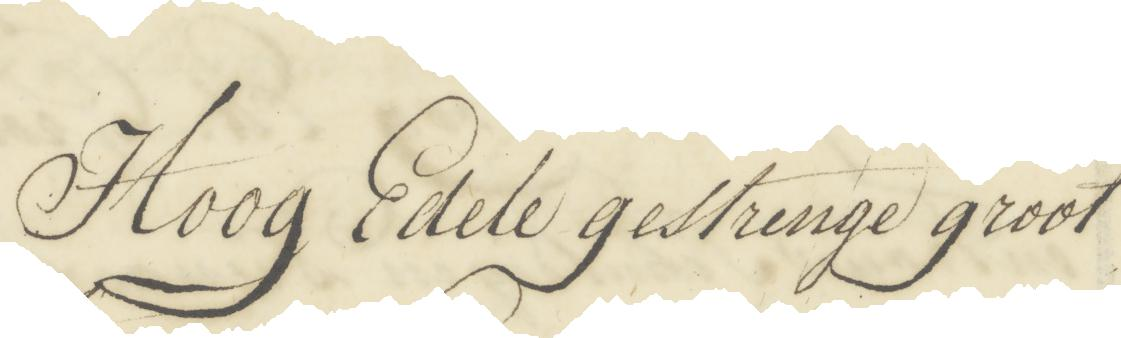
Hoog Edele gestrenge groot
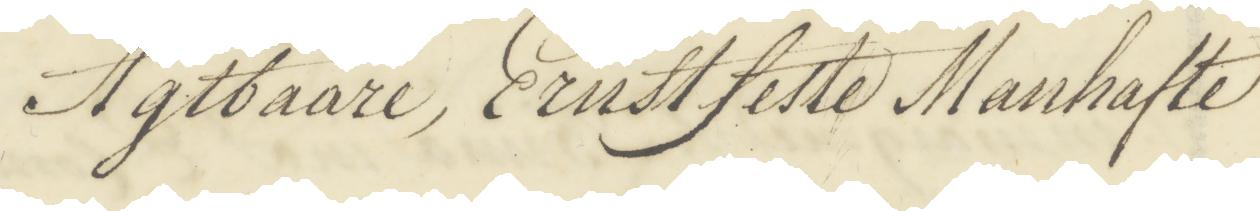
Agtbaare, Ernstfeste Manhafte
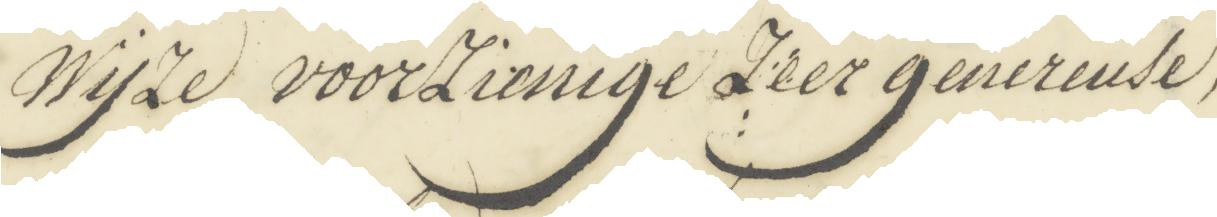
wijze voorzienige zeer genereuse,
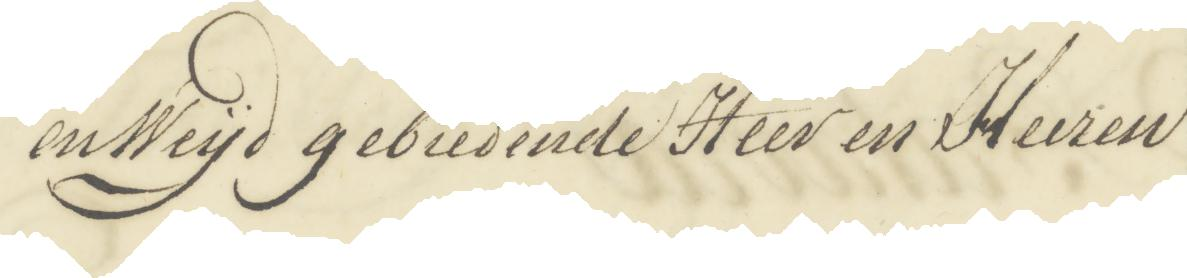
en weijd gebiedende Heer en Heeren
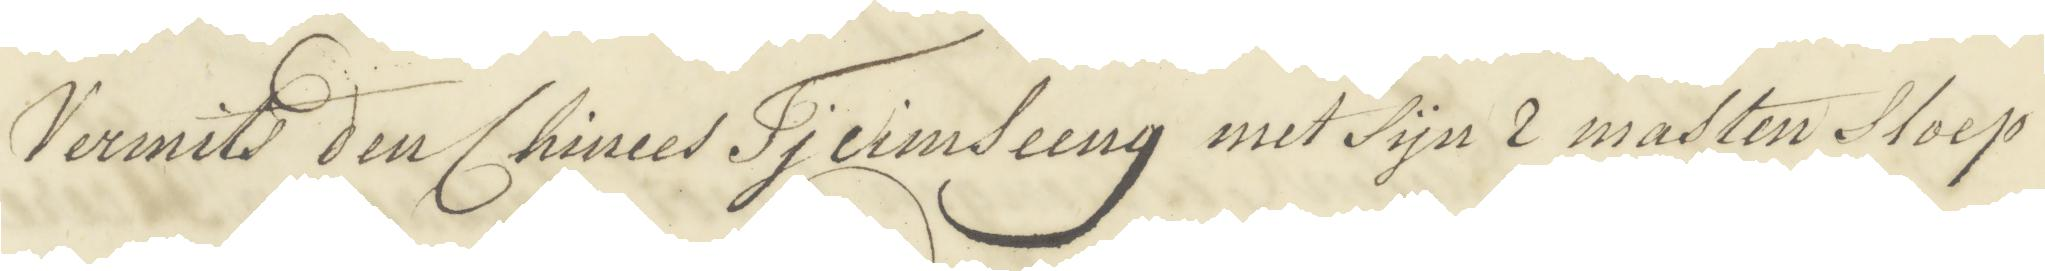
Vermits den Chinees Tjeimseeng met sijn 2 masten sloep
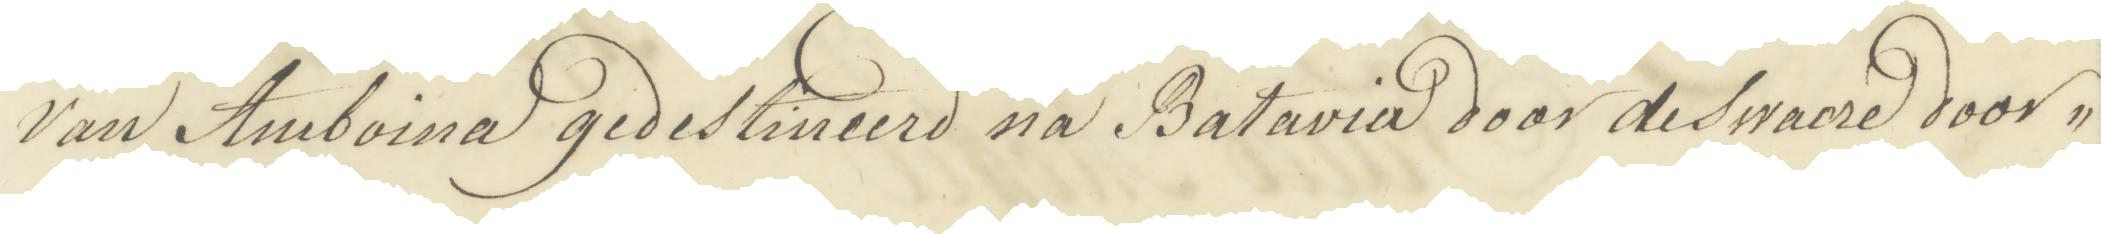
van Amboina gedestineerd na Batavia door deswaere door„
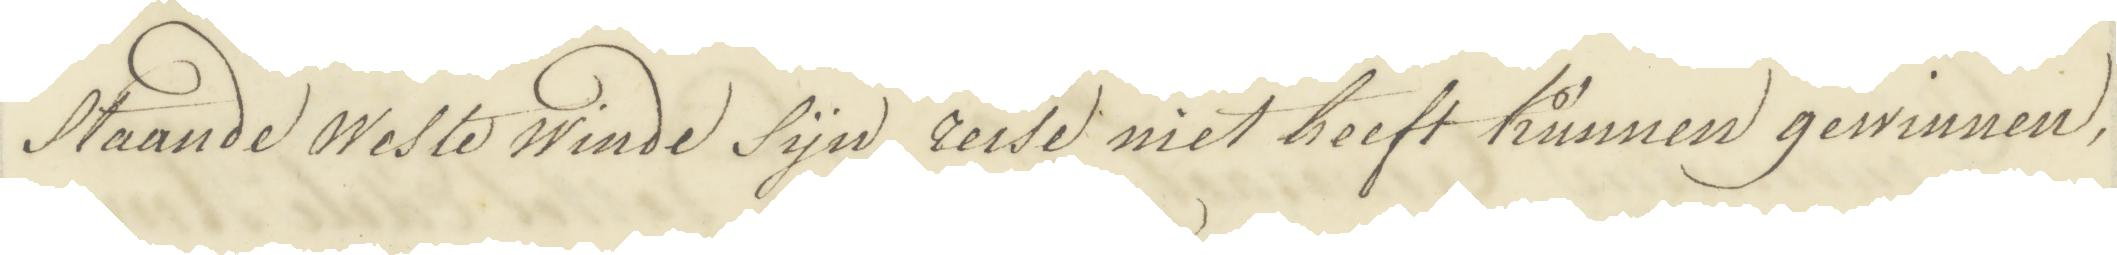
staande weste winde sijn reise niet heeft kunnen gewinnen,
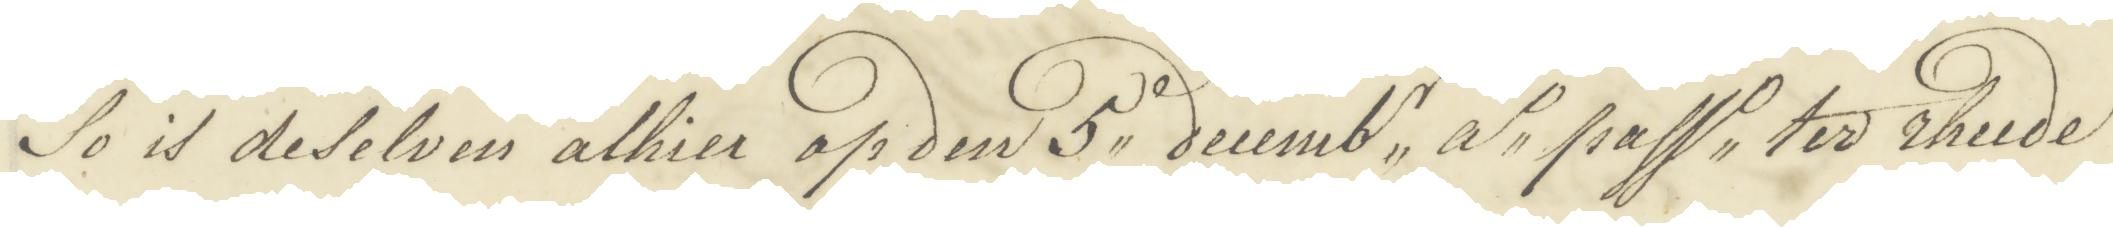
so is deselven alhier op den 5„e decemb„r a„o pass„o ter rheede
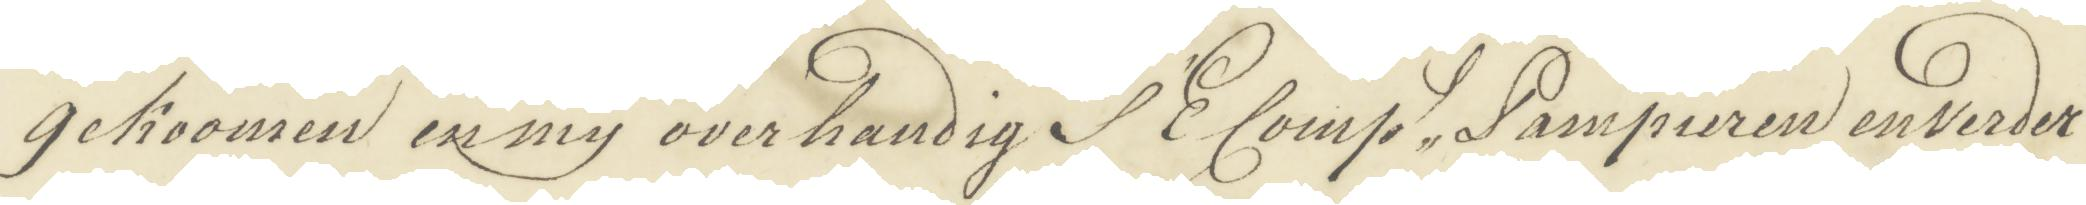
gekoomen en mij overhandig 's E Comp„s Pampieren en verder
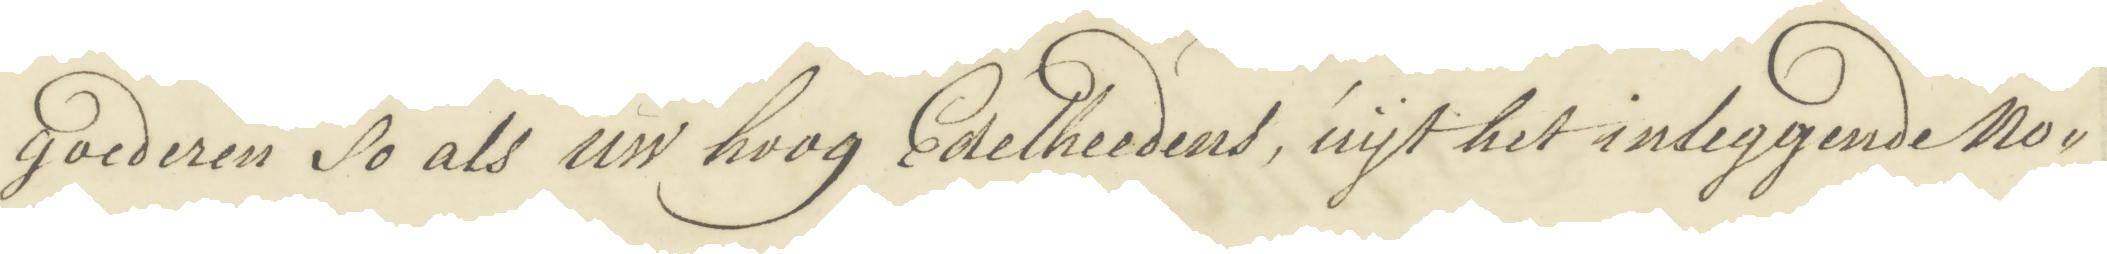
goederen so als uw hoog Edelheedens, uijt het inleggende No„
